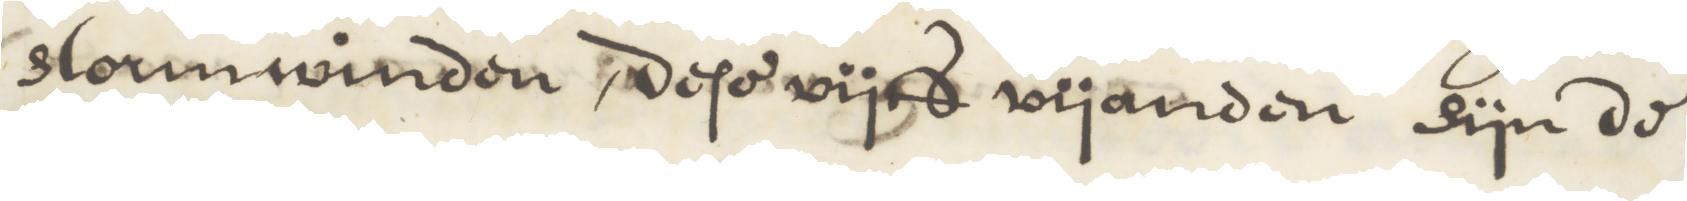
stormwinden, dese vijff vijanden sijn de
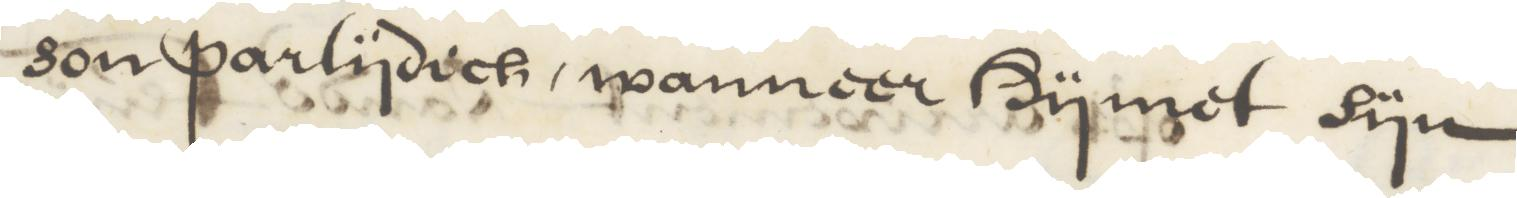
son partijdich, wanneer hij met sijn
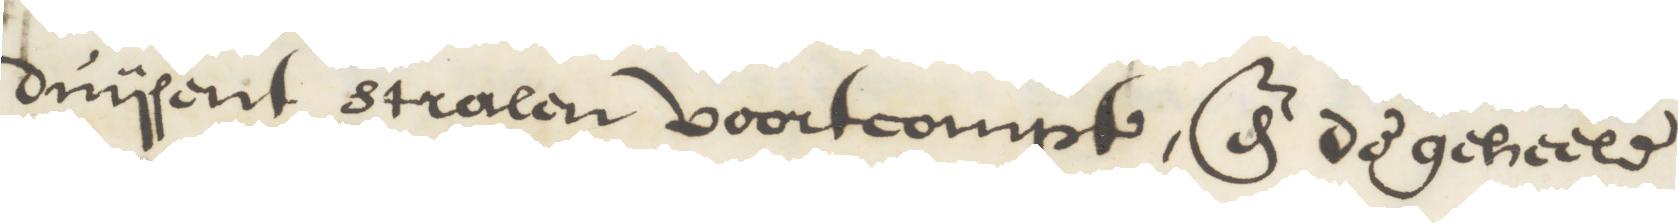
duijsent stralen voortcompt, ende de geheele
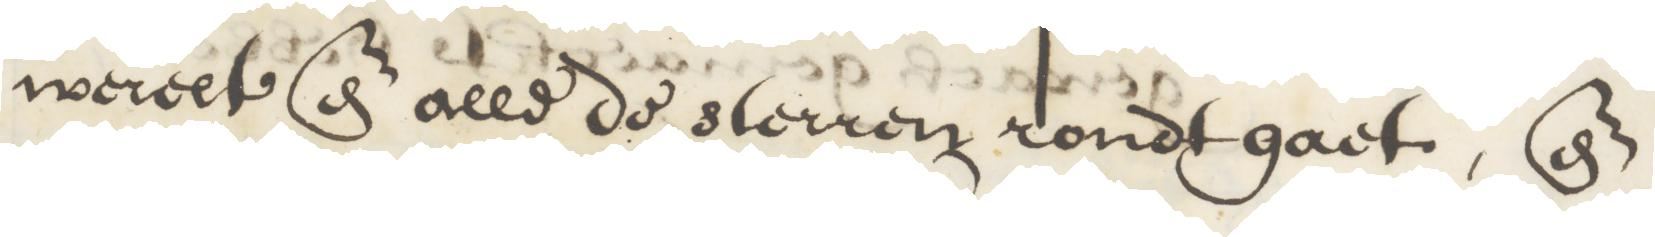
werelt ende alle de sterren rondt gaet, ende
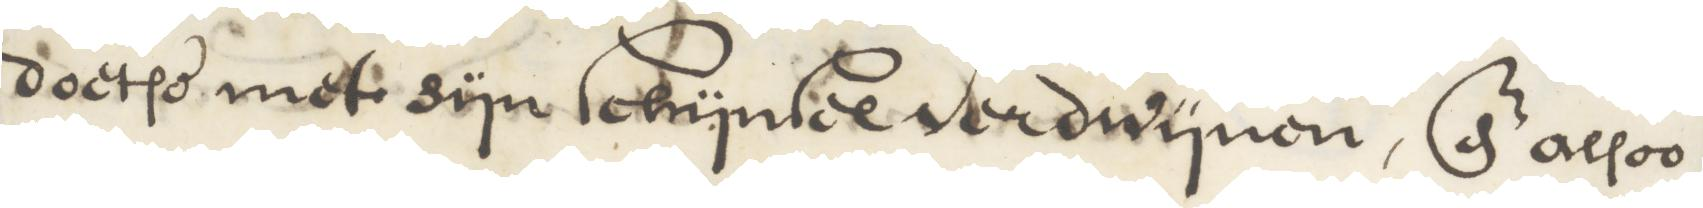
doetse met sijn schijnsel verdwijnen, ende alsoo
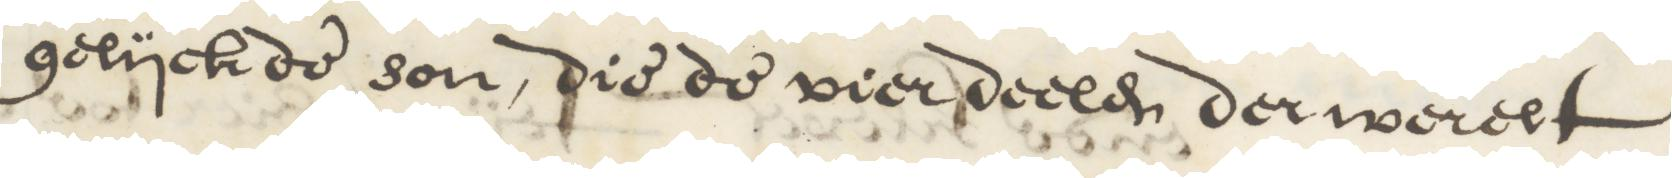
gelijck de son, die de vier deelen der werelt
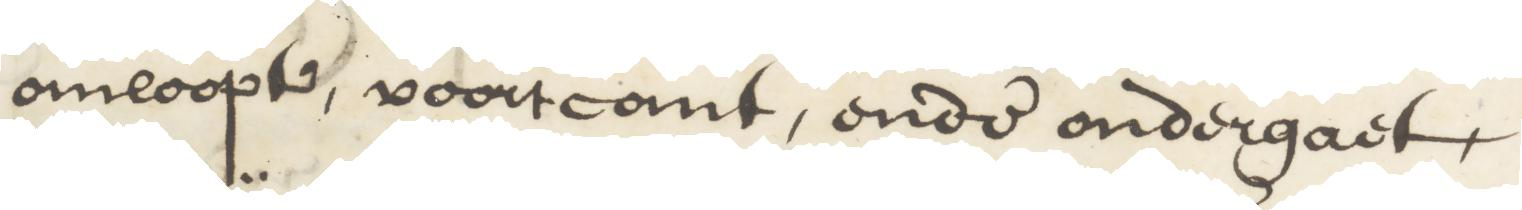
omloopt, voortcomt, ende ondergaet,
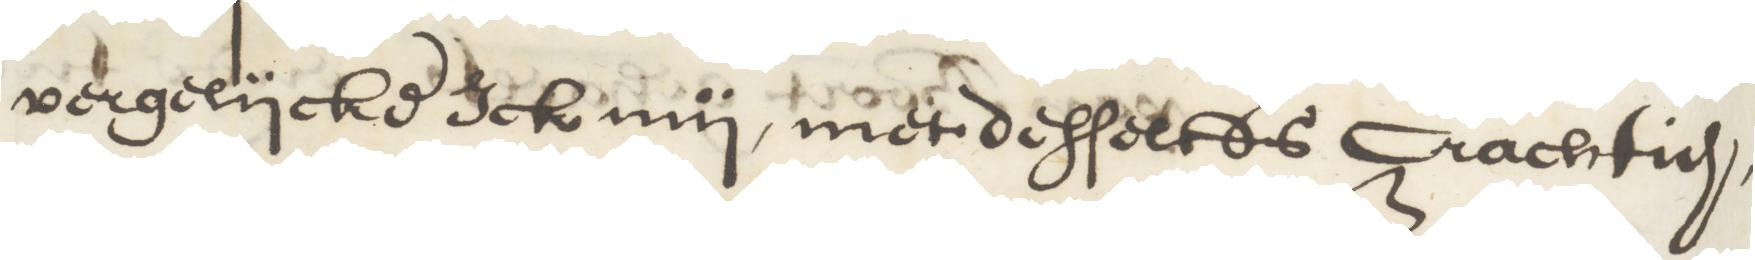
vergelijcke Ick mij, met desselffs crachtich,
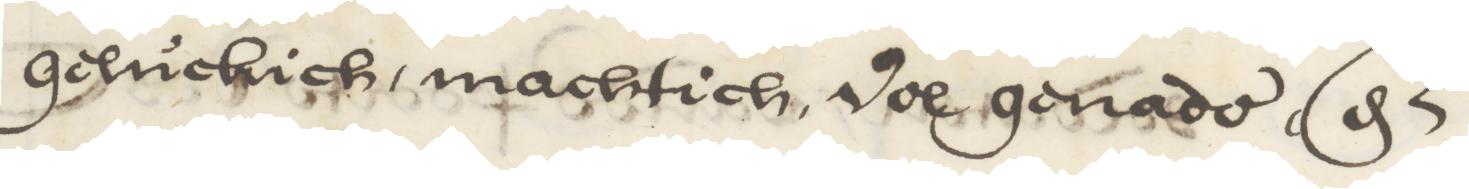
geluckich, machtich, vol genade ende
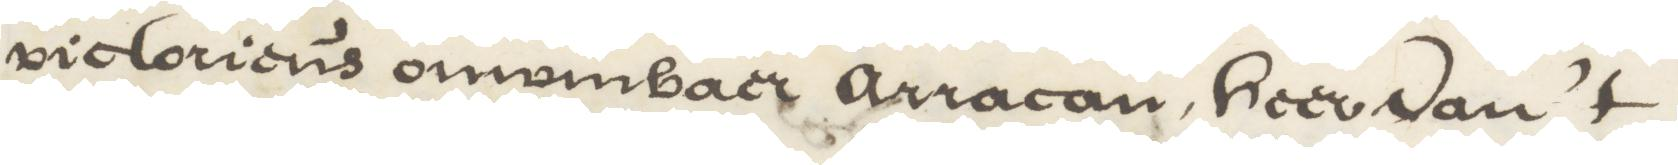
victorieus omwinbaer Arracan, heer van ’t
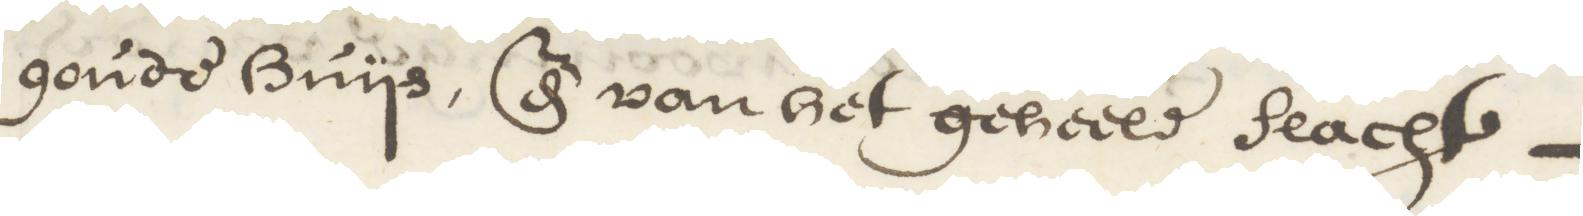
goude huijs, ende van het geheele slacht
